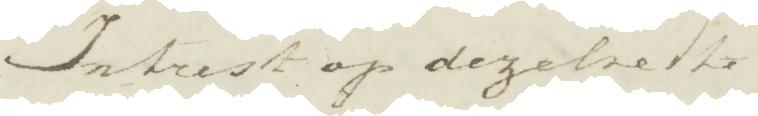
Intrest op dezelve te
